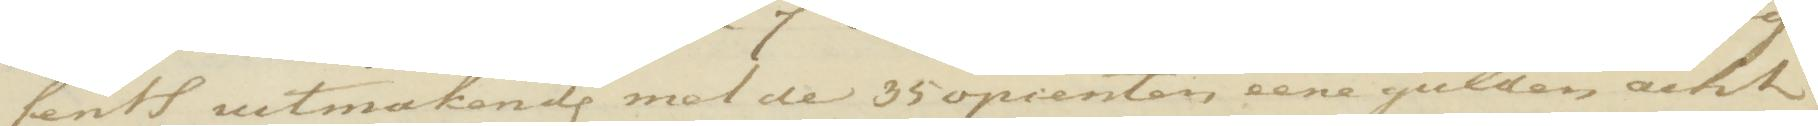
Cents uitmakende met de 35 opcenten eene gulden acht
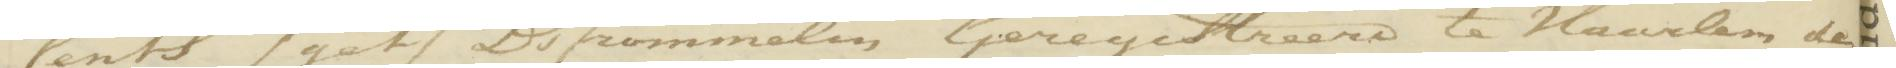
Cents /get/ DF Crommelin Geregistreerd te Haarlem den
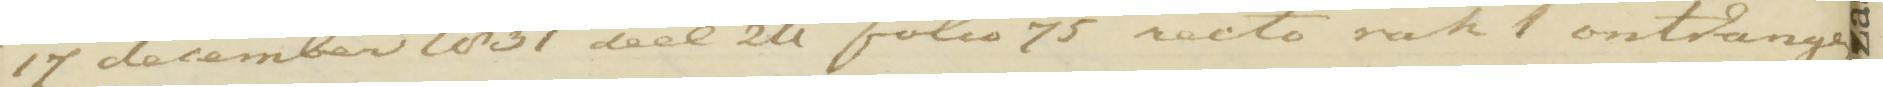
17 december 1831 deel 24 folio 75 recto vak 1 ontvangen
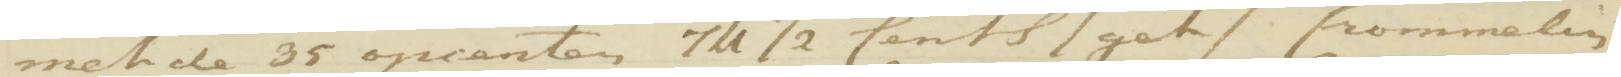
met de 35 opcenten 74½ Cents /get/ Crommelin.
